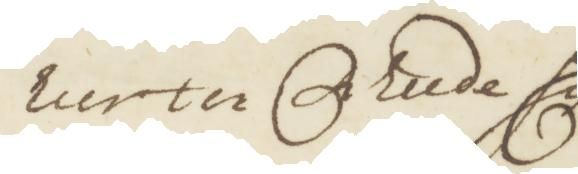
hier ter Rheede syn
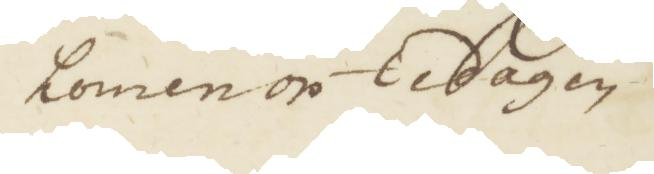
komen op te dagen
